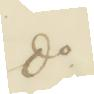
d.o
